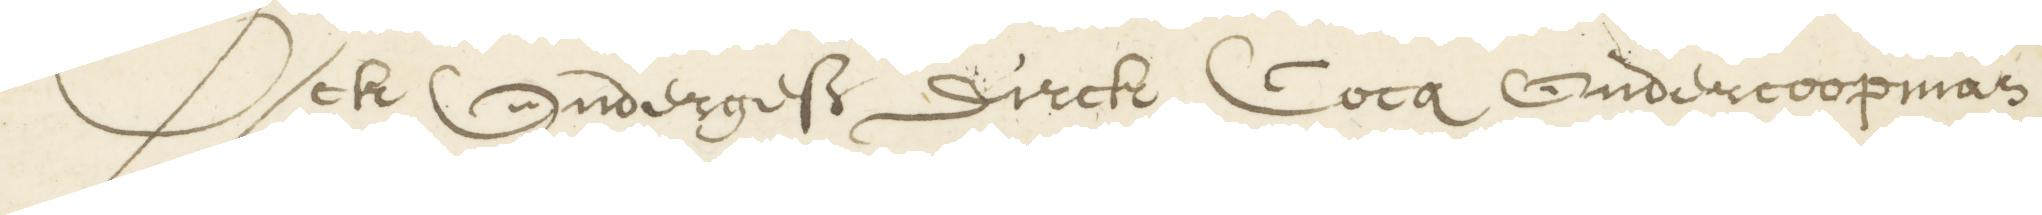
Jck Onderges Dirck Cocq Ondercoopman
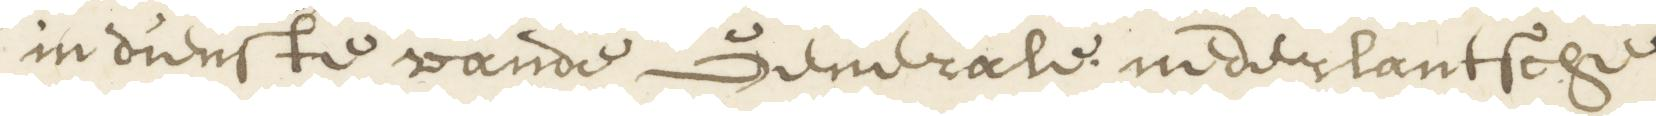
in dienste vande Generale nederlantsche
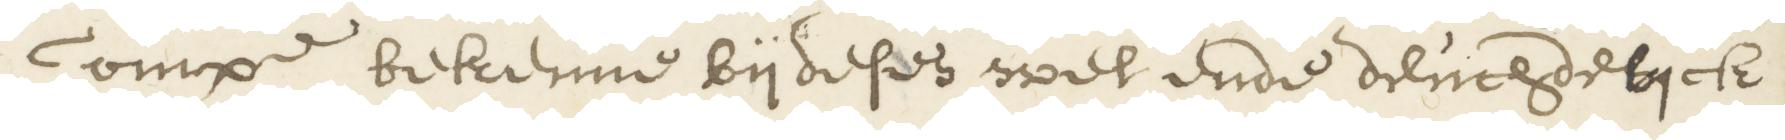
Compe bekenne bij desen wel ende deuchdelyck
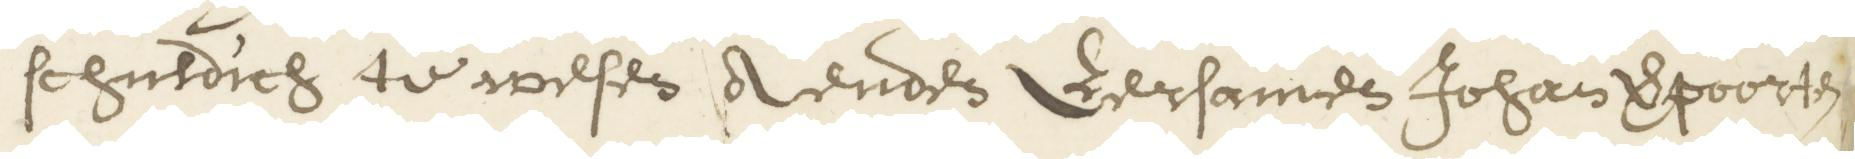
schuldich te wesen aenden Eersamen Johan verpoorten
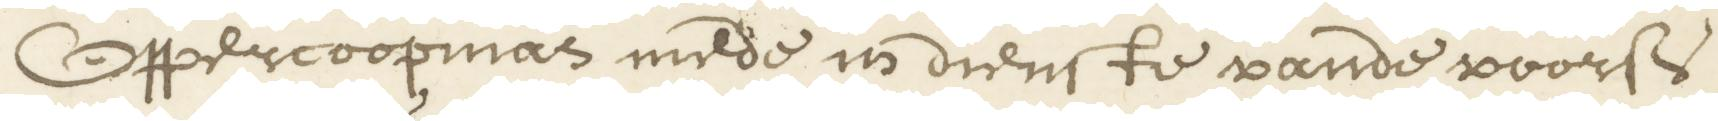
Oppercoopman mede in dienste vande voorsz
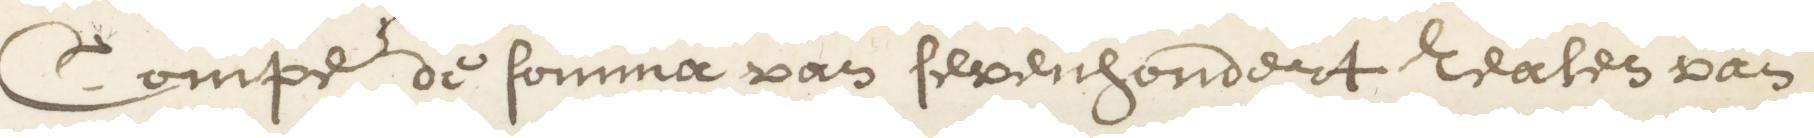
Compe de somma van sevenhondert realen van
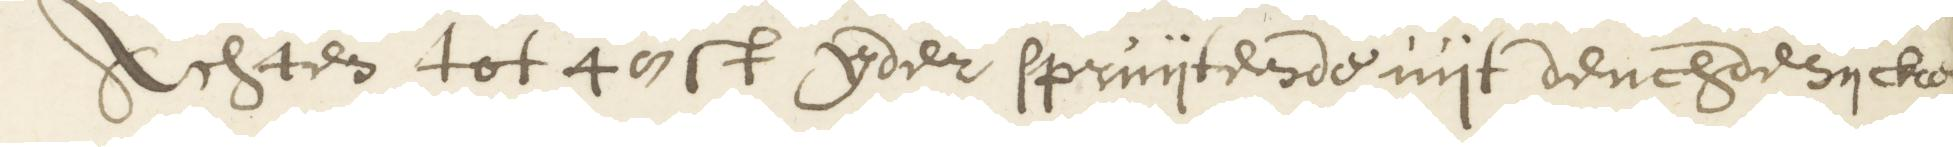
Achten tot 48st yder spruijtende uijt deuchdelijcke
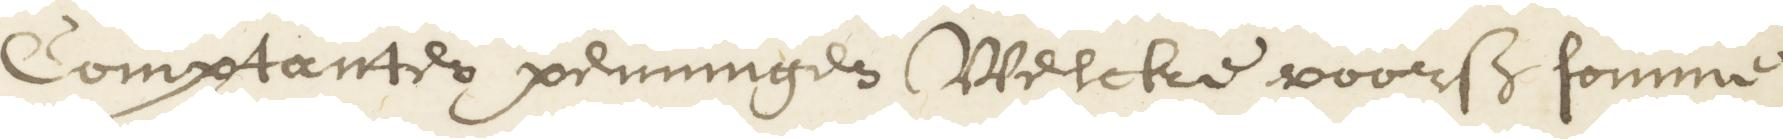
Comptanten penningen Welcke voors somme
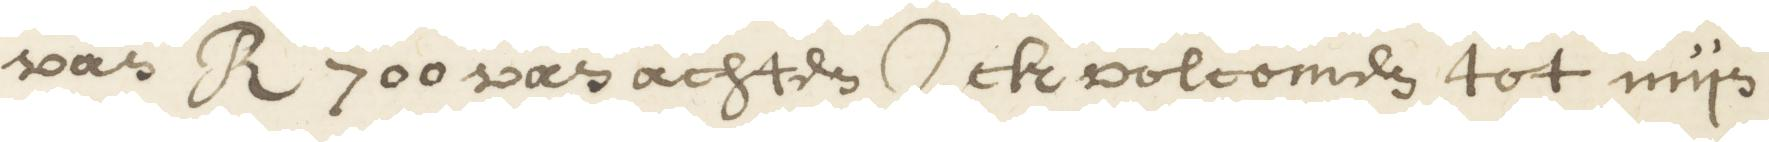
van R 700 van achten Jck volcomen tot mijn
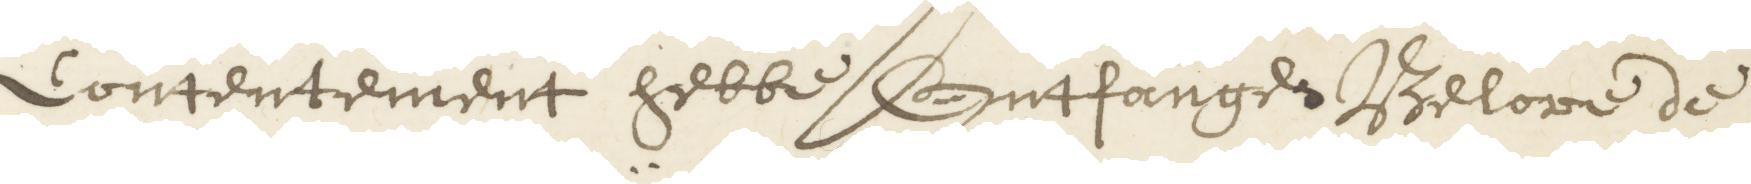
Contentement hebbe Ontfangen Belove de
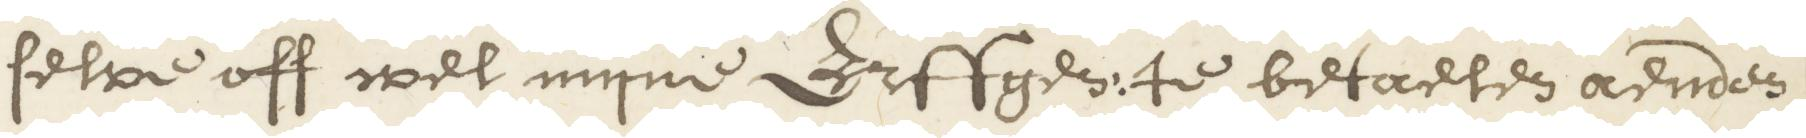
selve off wel mijne Erffgen: te betaelen aenden
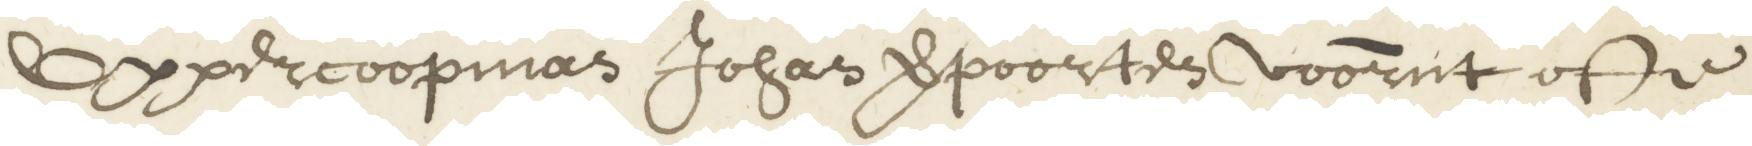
Oppercoopman Johan verpoorten voornt ofte
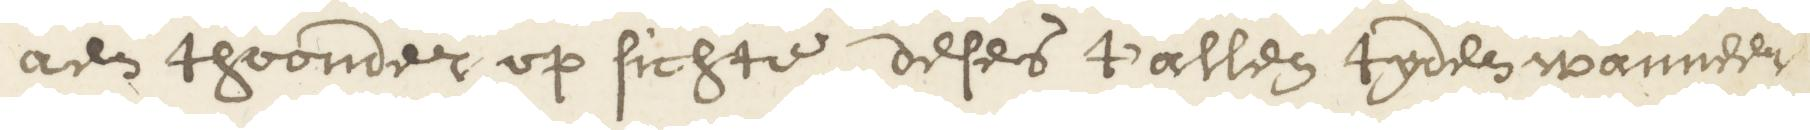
aen thoonder op sichte deses t' allen tyden wanneer
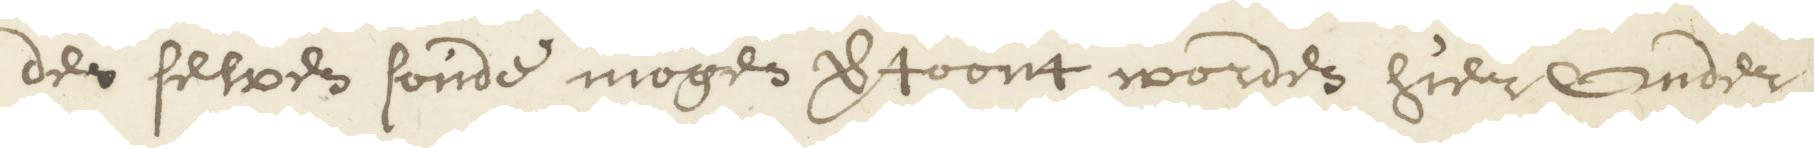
den selven soude mogen vertoont worden hier Onder
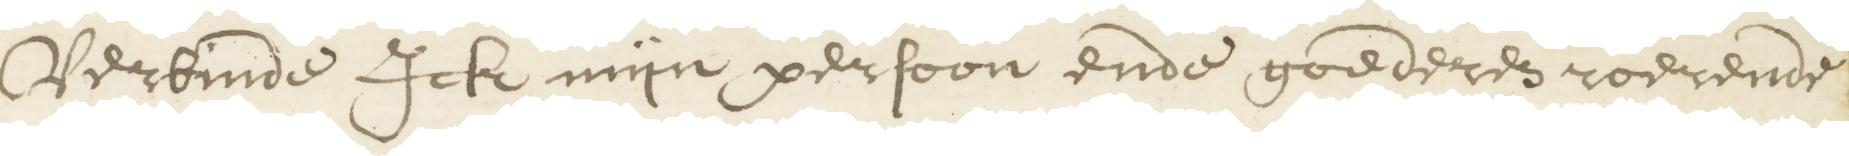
Verbinde Jck mijn persoon ende goederen roerende
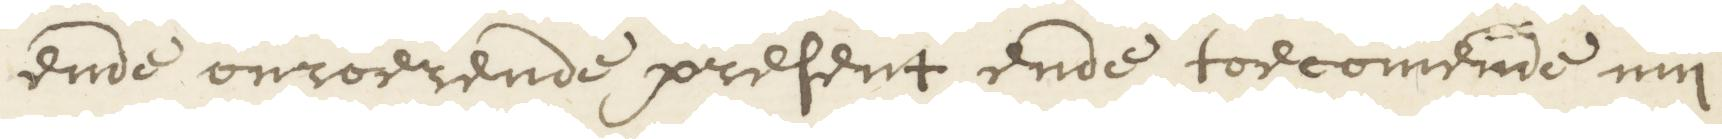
ende onroerende present ende toecomende mij
